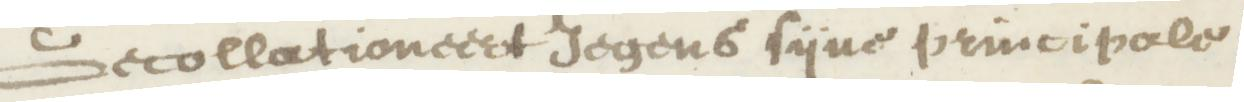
Gecollationeert Iegens sijne principale
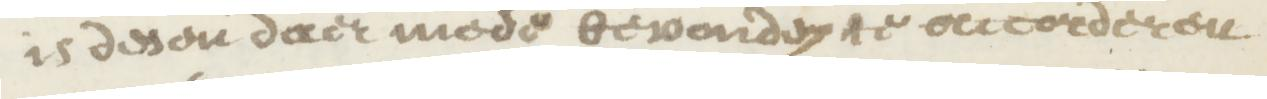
is desen daer mede bevonden te accorderen
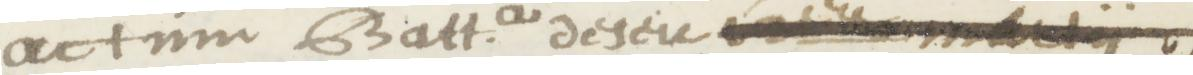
actum Batt.a desen 12-en martij
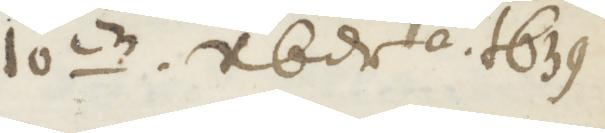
1639 Bij mij 10-en. xber a. 1639
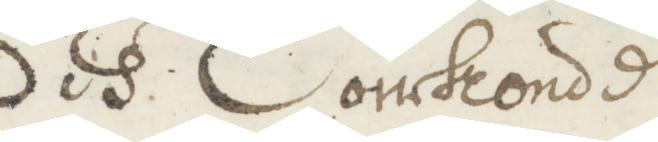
Des Toirkonde
